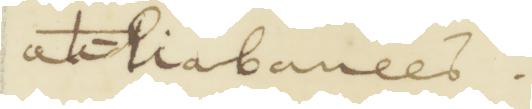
atcliabanees
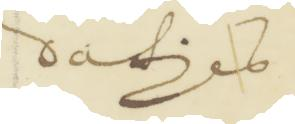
dasjes
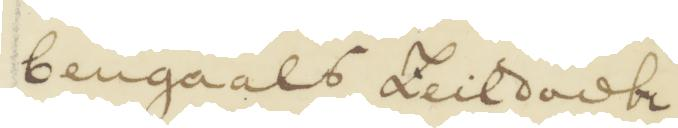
bengaals Zeildoek
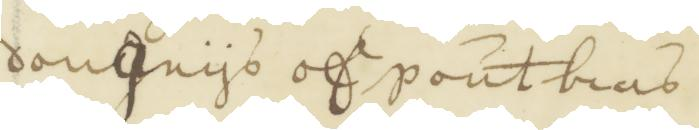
dongrijs of poutkas
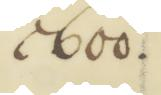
5600.
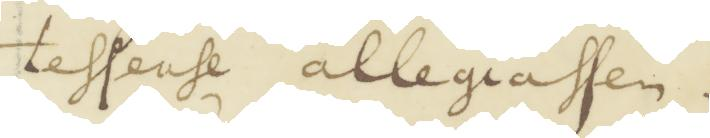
tesserse allegiassen
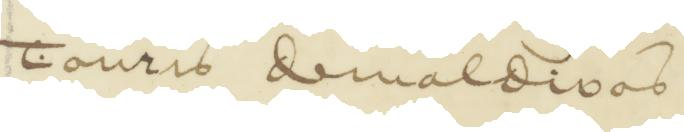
couris demaldivas
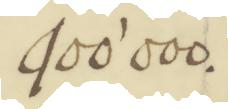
400'000.
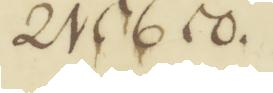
215650.
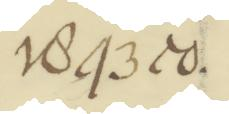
184350.
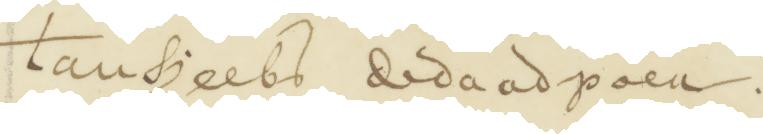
tansjeebs dedaadpoer
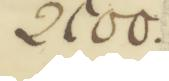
2500.
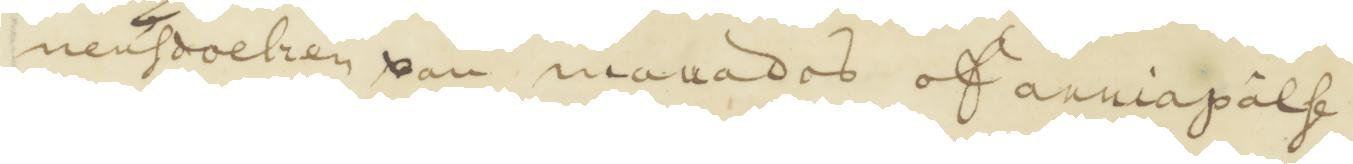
neusdoeken van marados of arriapâlse
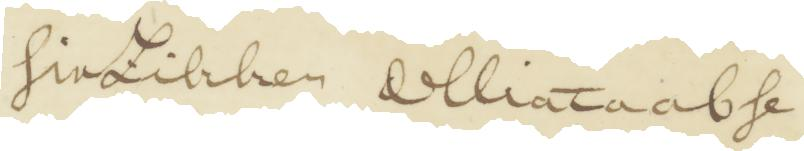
sirzikken delliacaabse
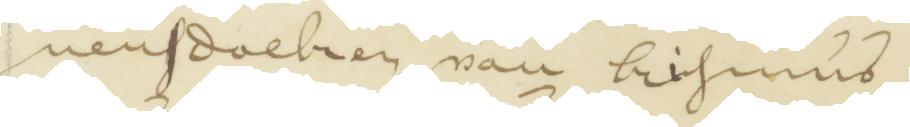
neusdoeken van kismus
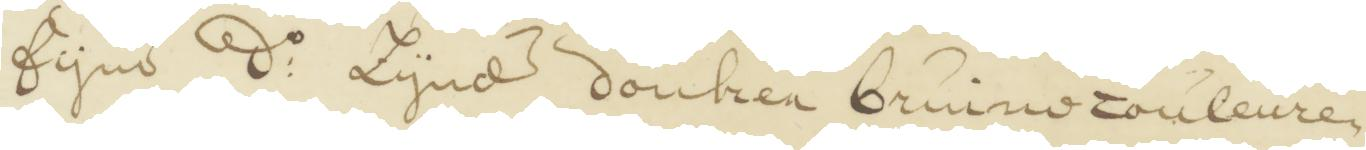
fijne d:o Zijnde donker bruine couleuren
